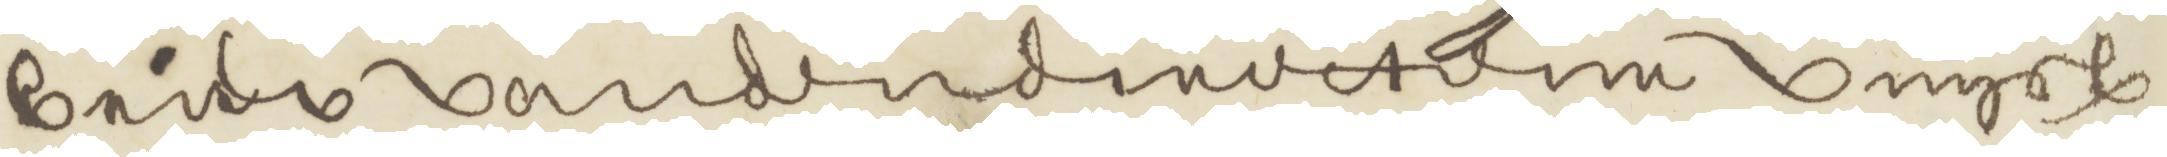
briev van den directeur Vuijst
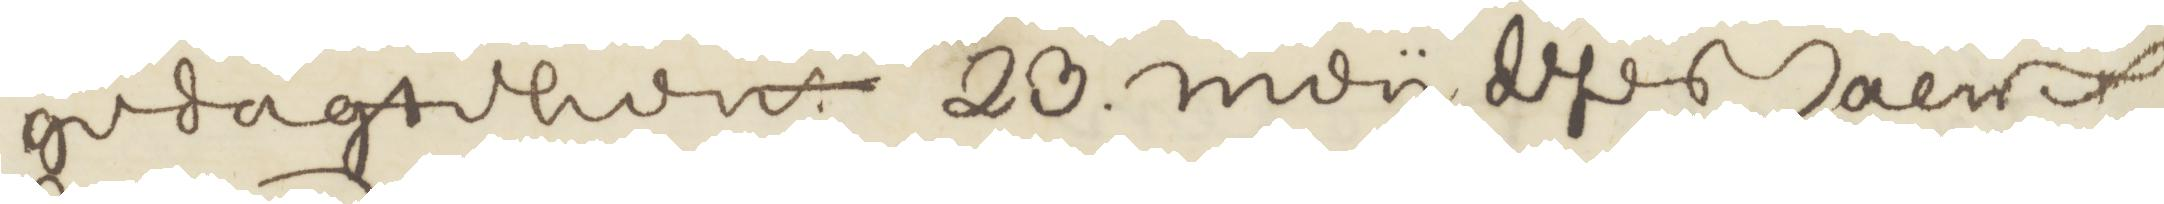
gedagtekent 23. meij deses Jaers
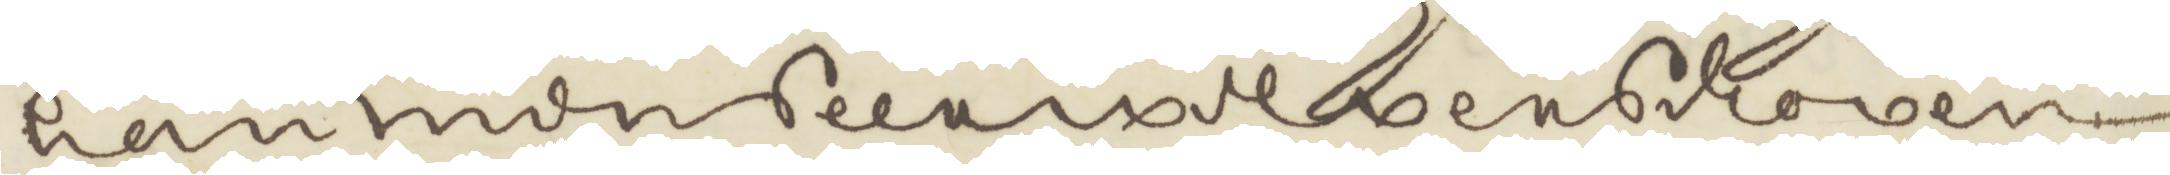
kan men seer wel verschoven
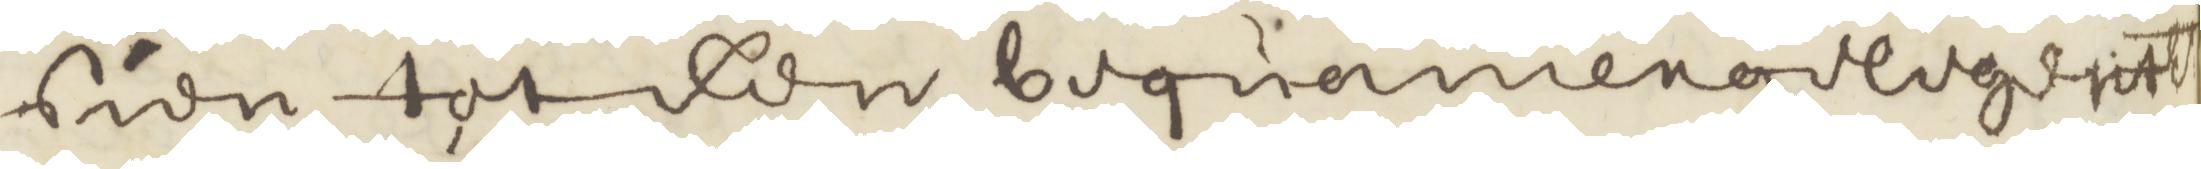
sien tot Een bequamer gelegenth:t
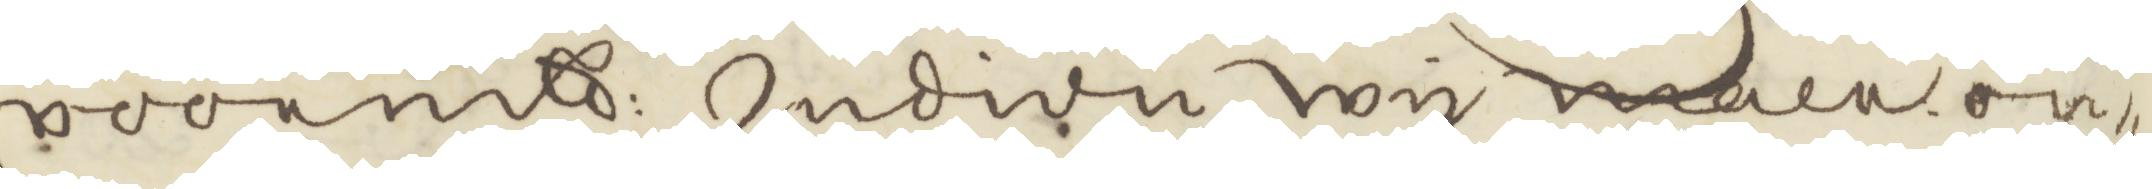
voor uEd: Jndien wij maer on„
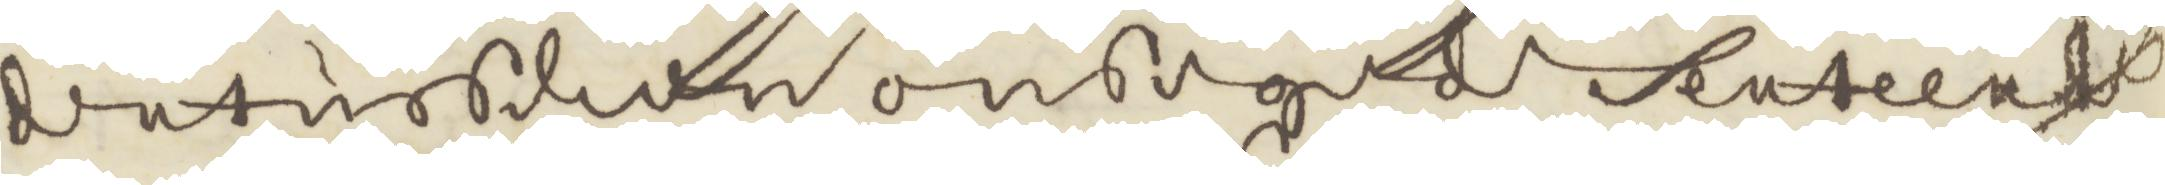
dertusschen onse gedeserteerde
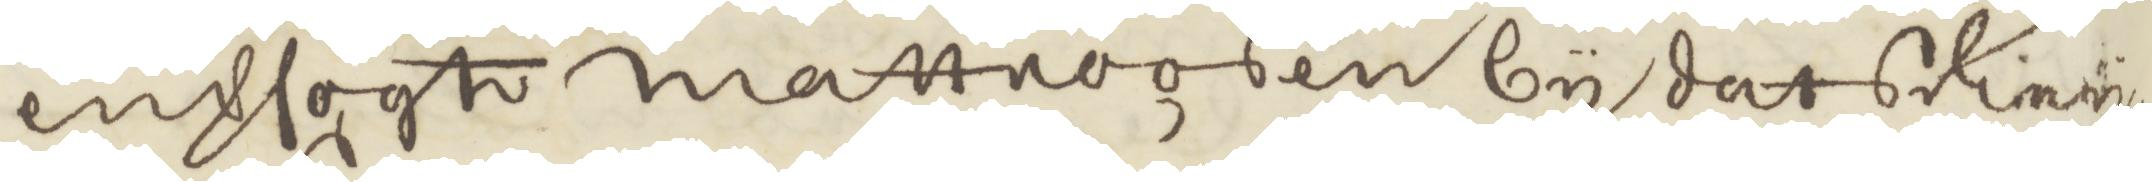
en versogte Mattroosen bij dat schrij,
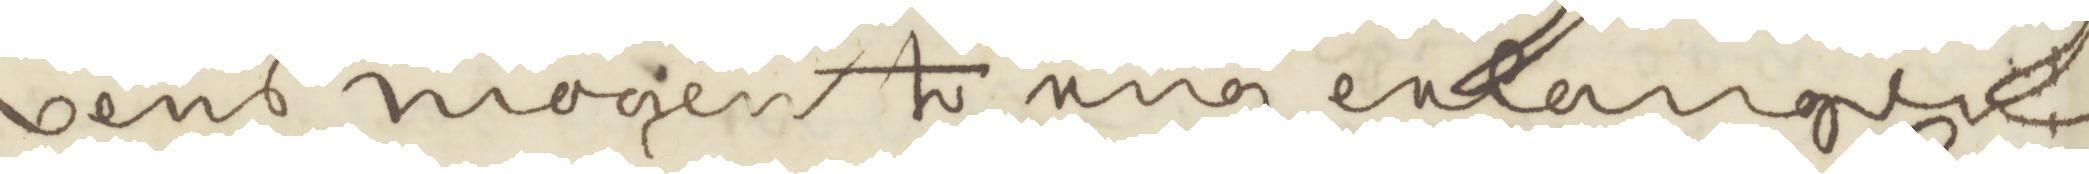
vens mogen te rug erlangen
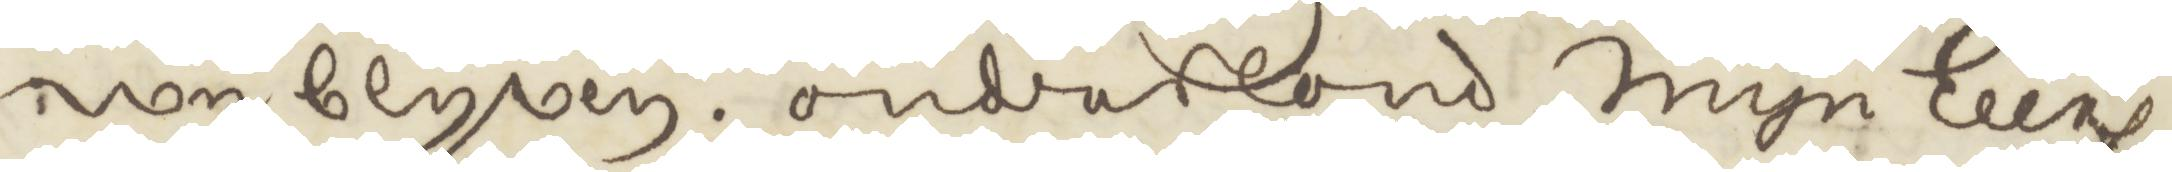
wij blijven. onderstond Mijn heer
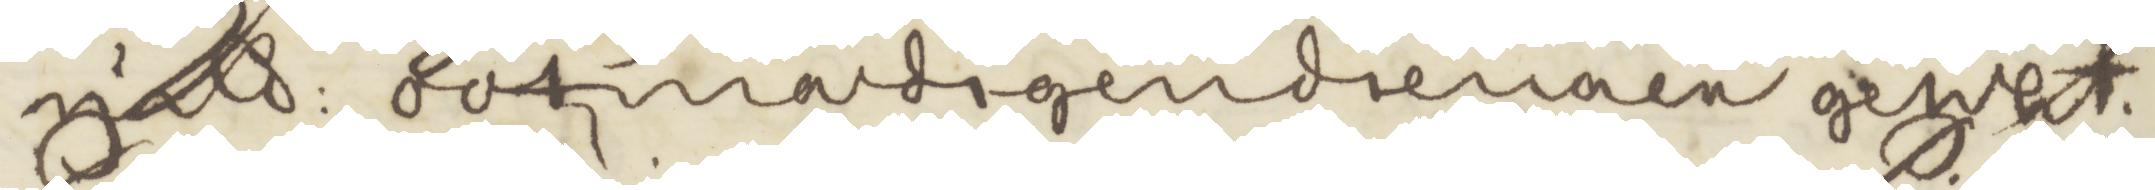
uEd: ootmoedigen dienaer getekt.
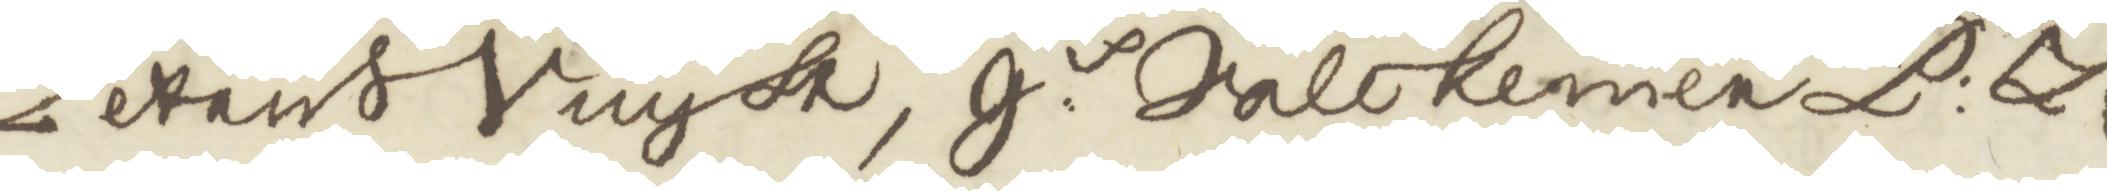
Petrus Vuijst, g:s Valckenier P:z
